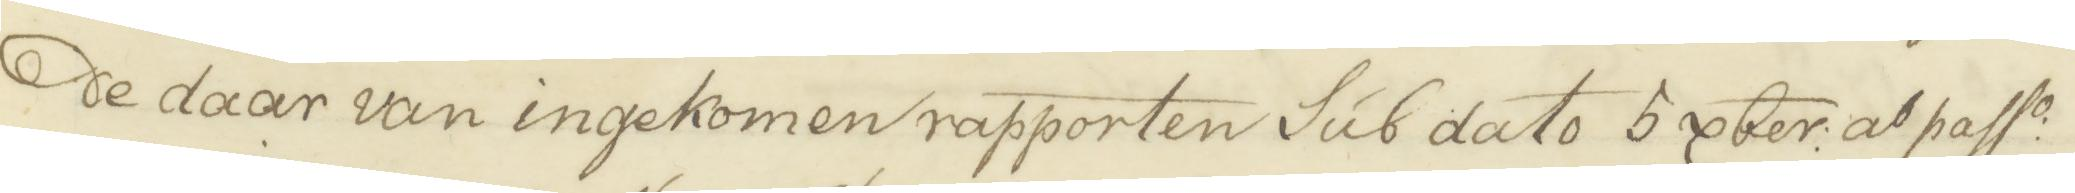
de daar van ingekomen rapporten sub dato 5 xber: ao pass:o
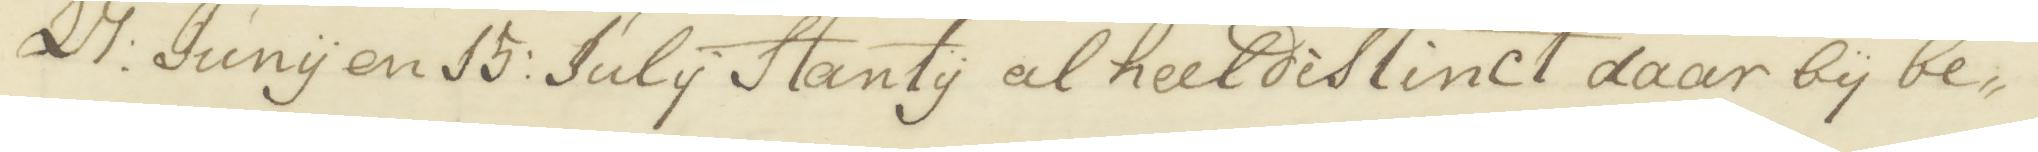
27: Iunij en 15: Iulij stantij al heel distinct daar bij be„
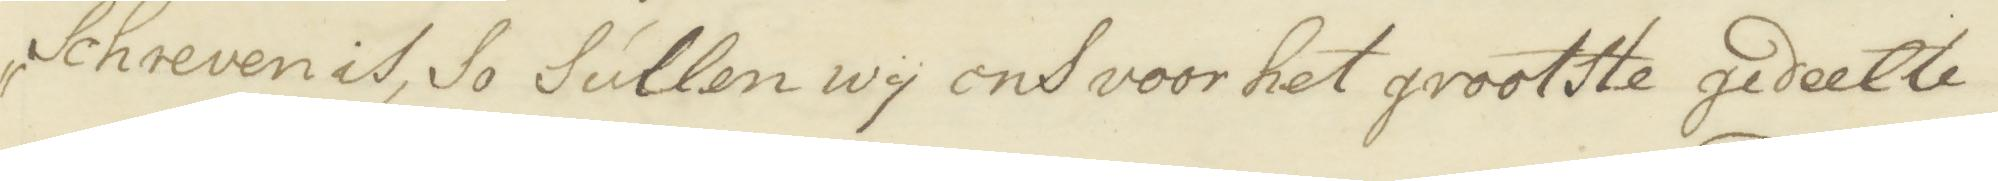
„schreven is, so sullen wij ons voor het grootste gedeelte
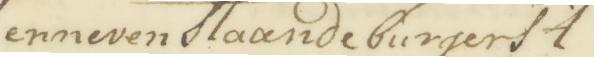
en nevenstaande burgers ’t
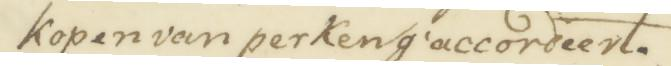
kopen van perken g'accordeert.
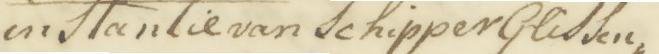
instantie van schipper Glissen„
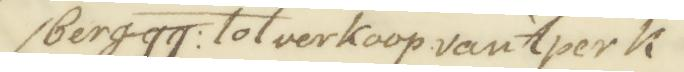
berg qq: tot verkoop van 't perk
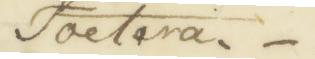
Toetera. -
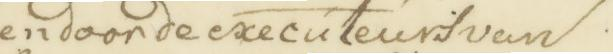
en door de executeurs van
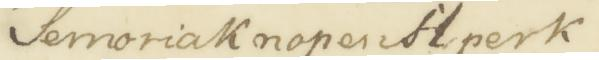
Semoriak nopens 't perk
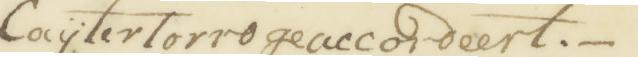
Caijtertorro geaccordeert.—
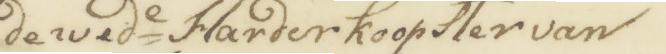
de wed=e Harder koopster van
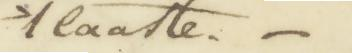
't laaste. -
